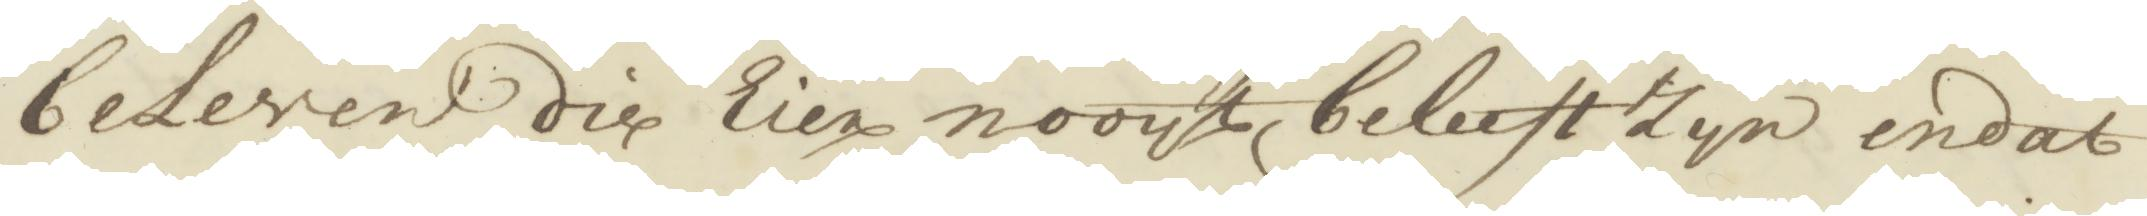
beleven die hier nooyt beleeft Zijn en dat
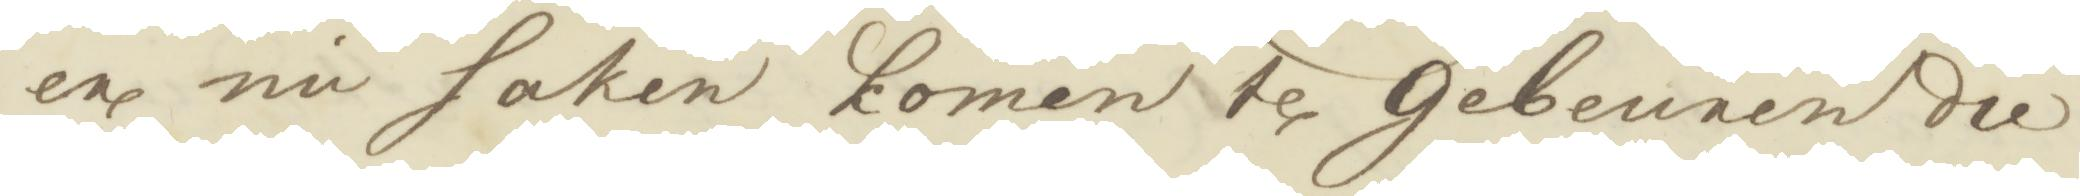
er nu Saken komen te gebeuren die
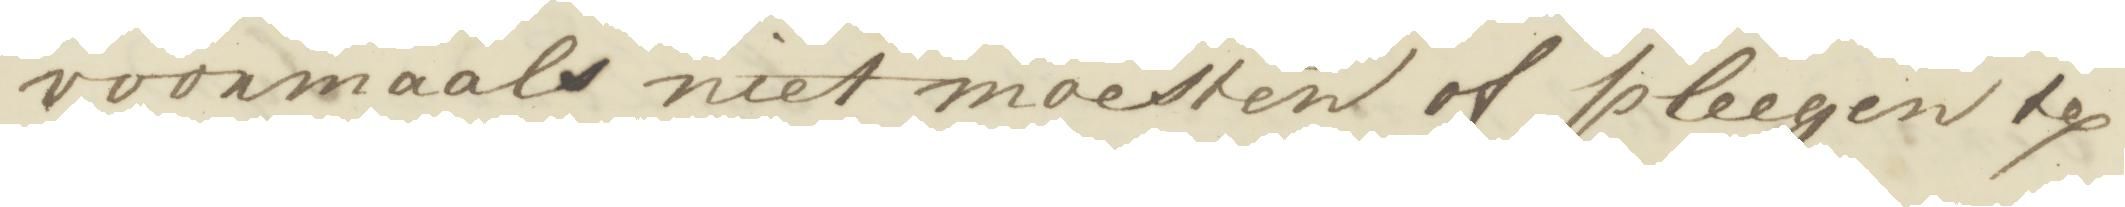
voormaals niet moesten of pleegen te
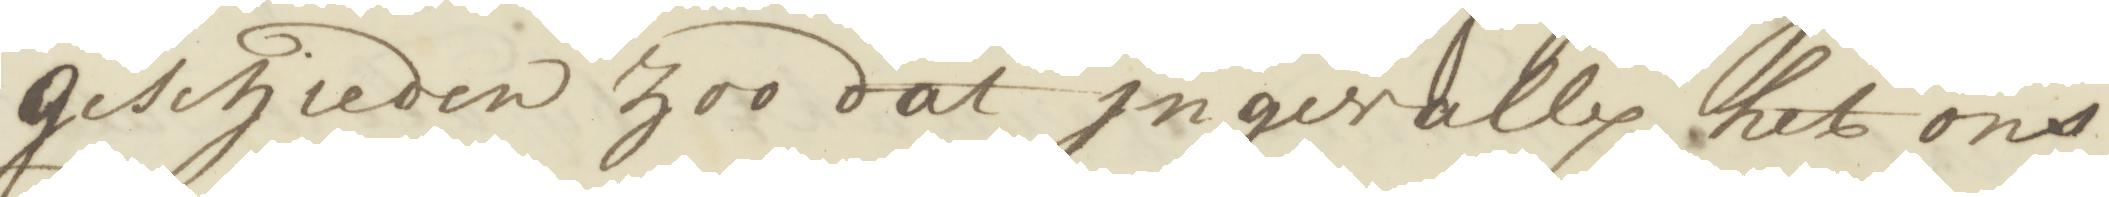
geschieden Zoo dat jngevalle het ons
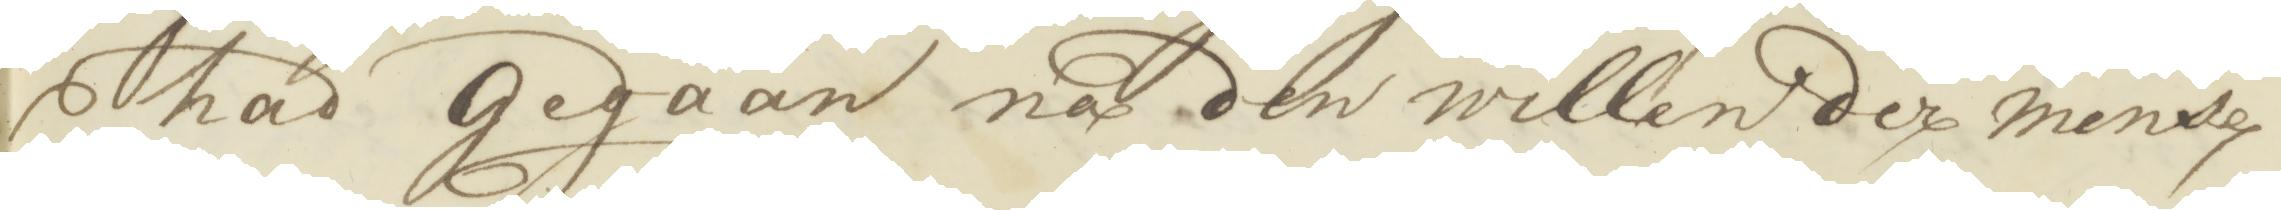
had gedaan na den willen der mense
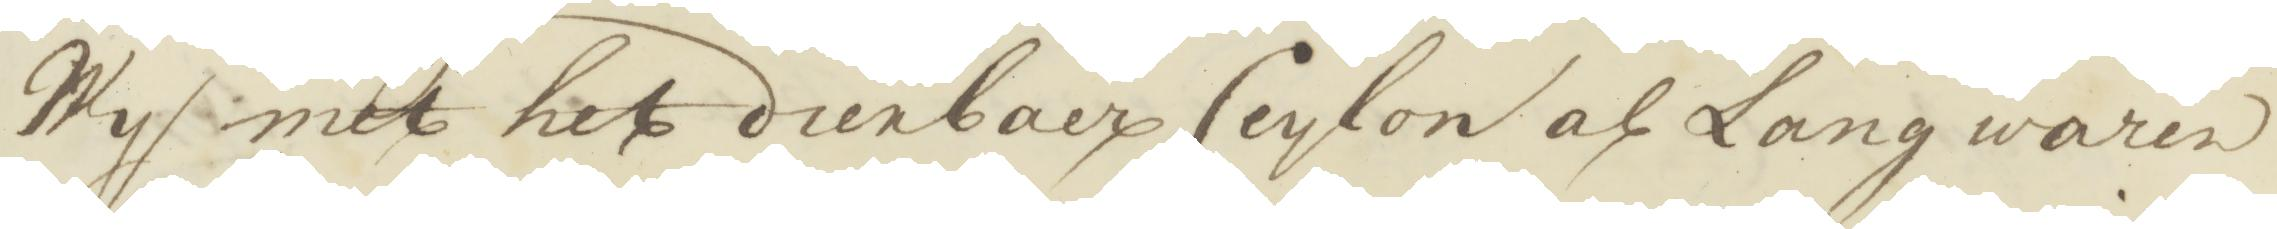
Wy met het dierbaer Ceylon al Lang waren
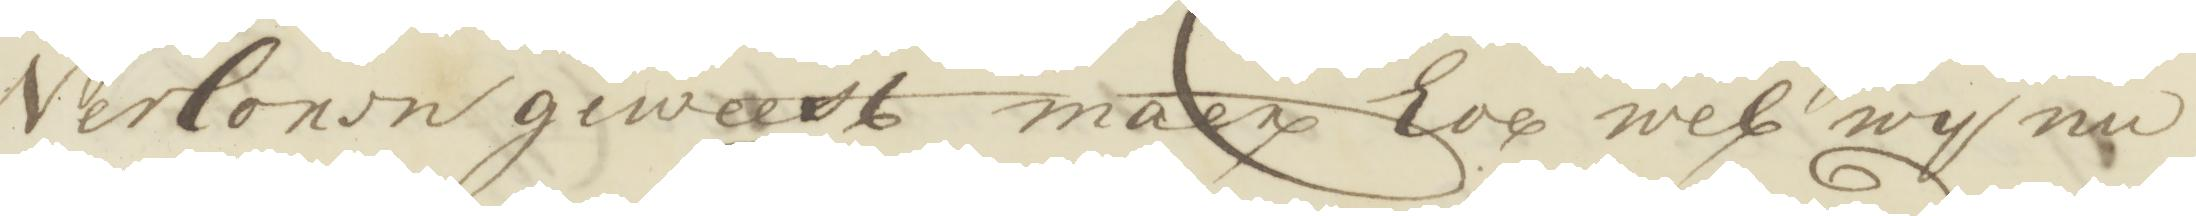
Verloren geweest maer hoe wel wy nu
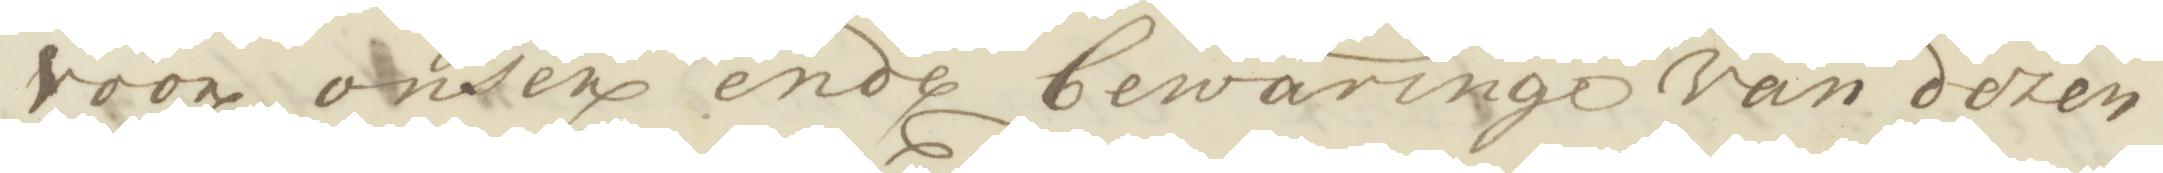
voor onser ende bewaringe van dezen
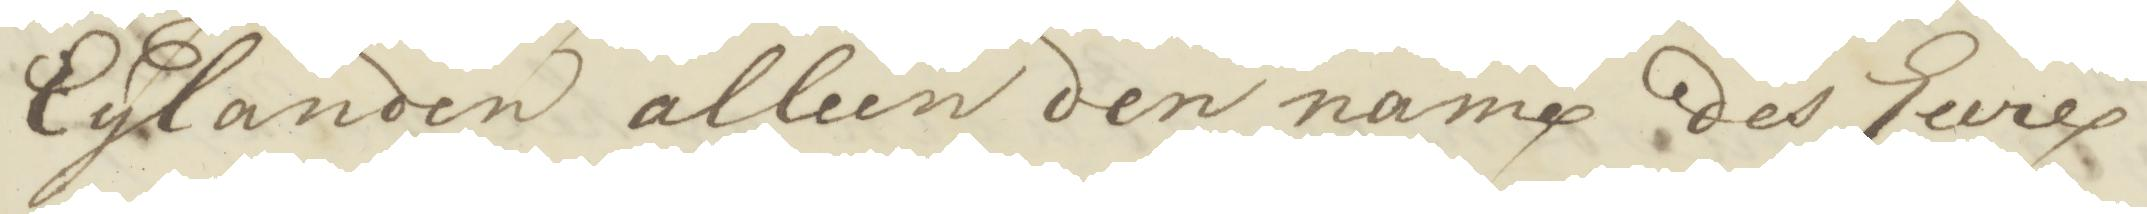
Eylanden alleen den name des Heere
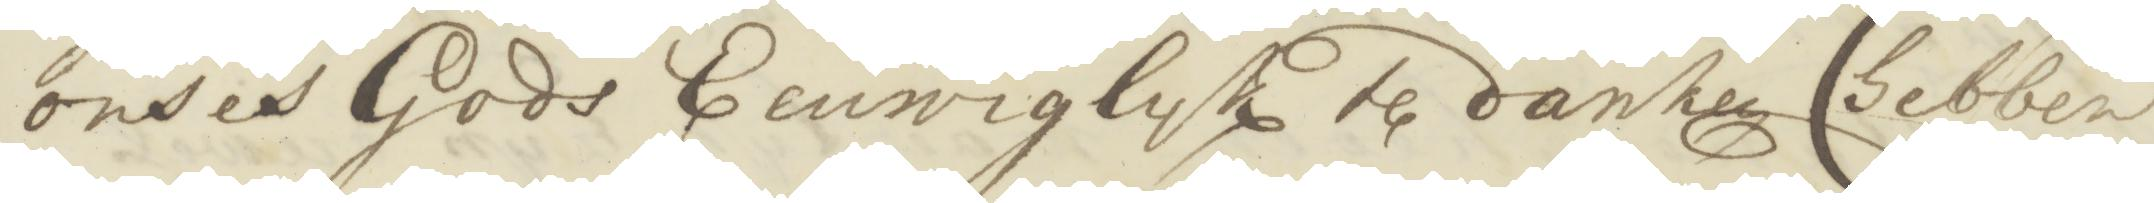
onses Gods Eeuwiglyk te danken hebben
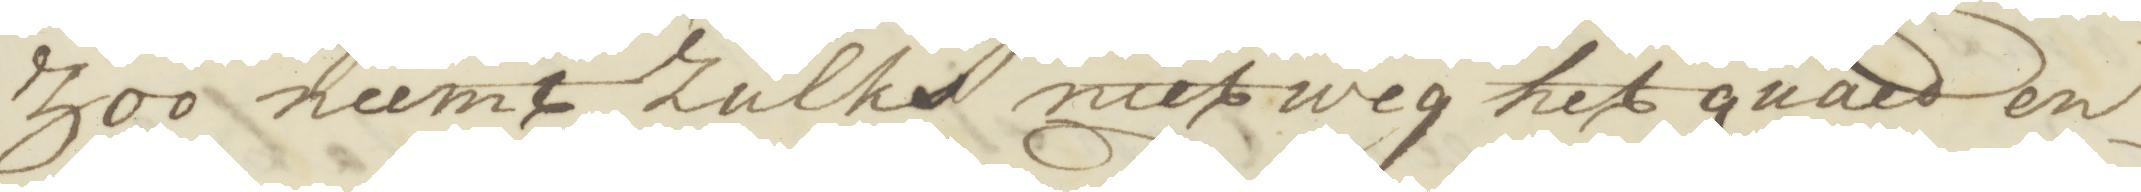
Zoo neemt Zulks niet weg het quaed en
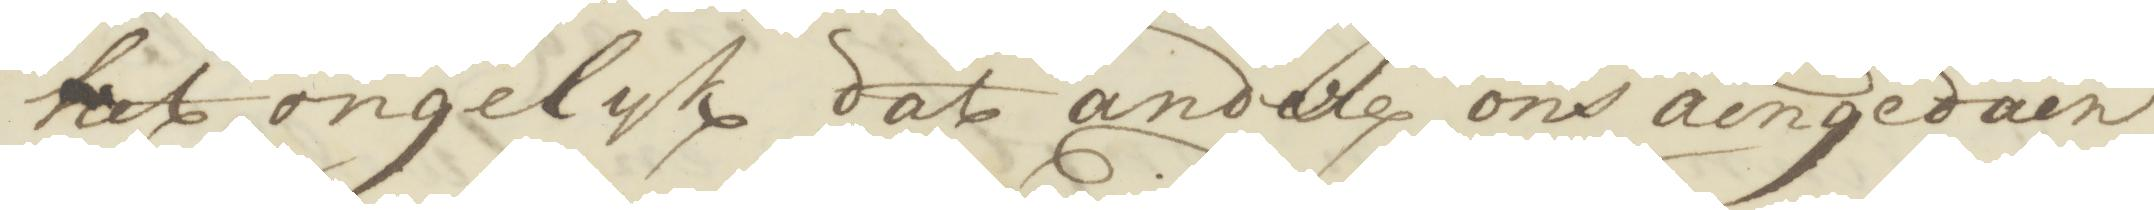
het ongelyk dat andere ons aengedaen
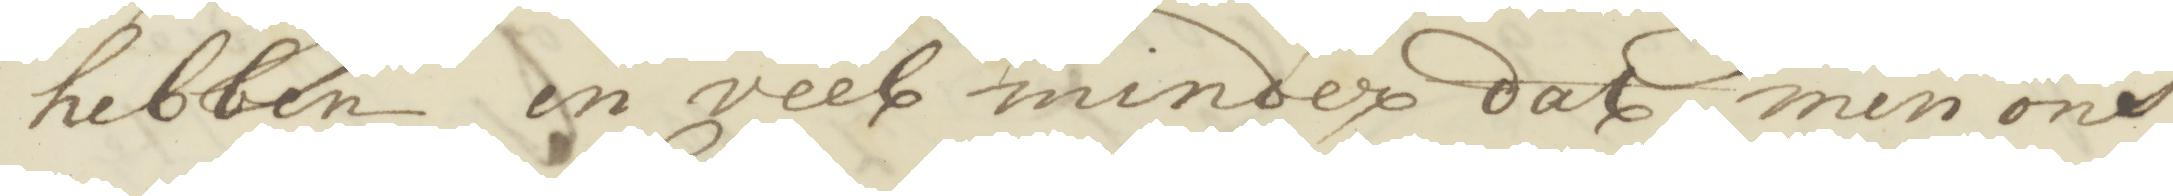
hebben en veel minder dat men ons
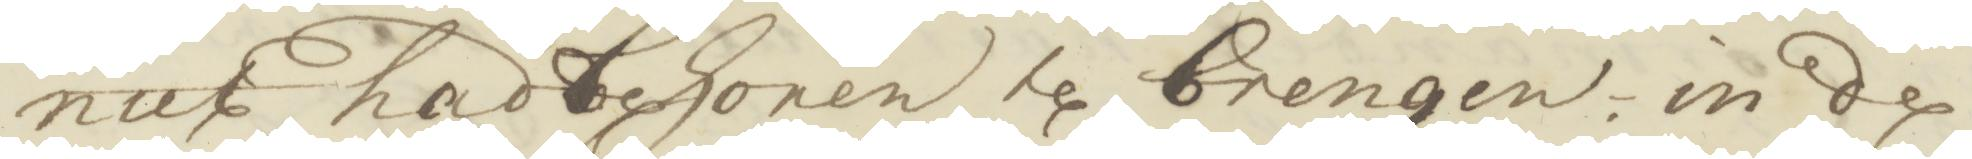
niet had behoren te brengen: in de
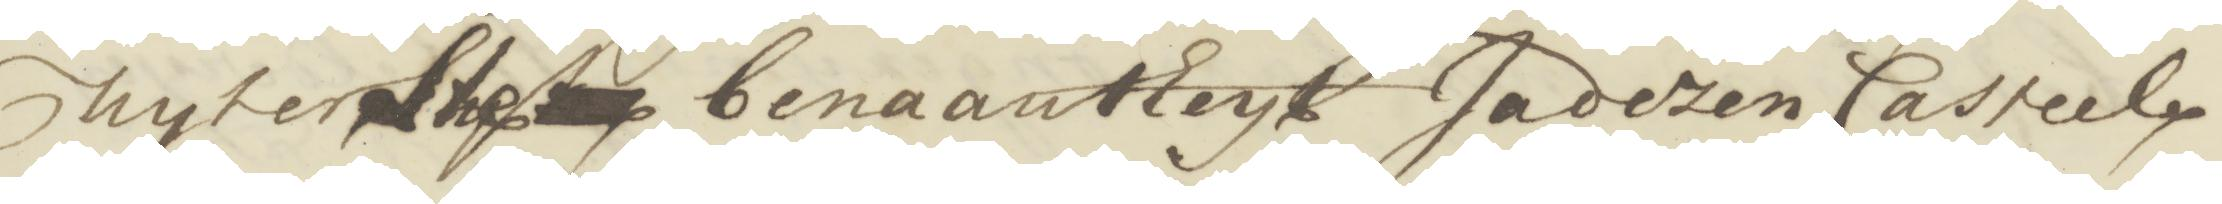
uytersteter benaautheyt Ja dezen Casteel
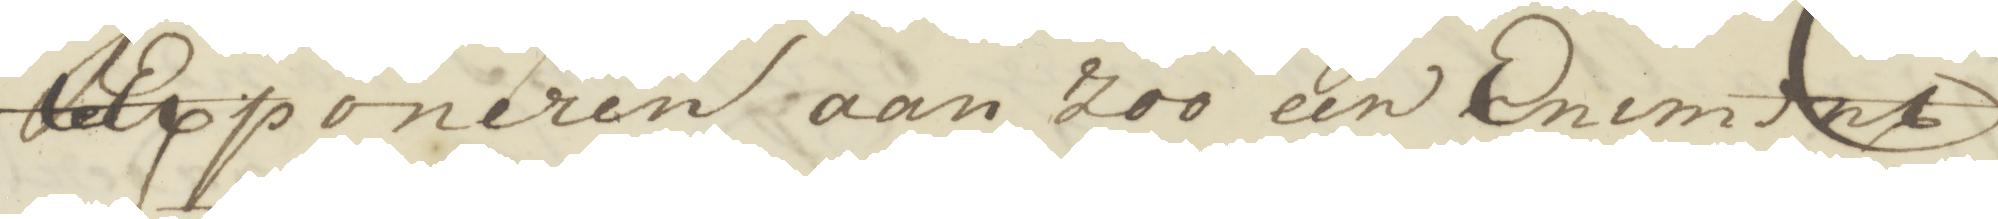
te Exponeren aan zoo een Eniment
